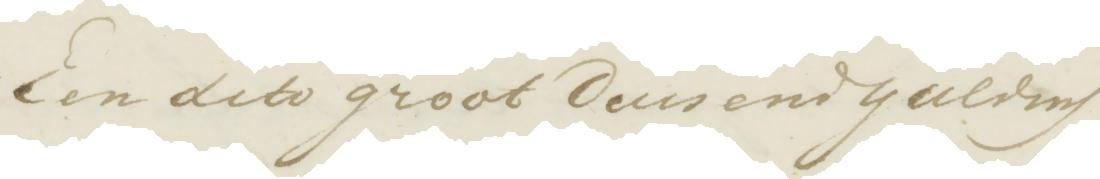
Een dito groot duisend guldens
